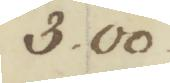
3. 00
